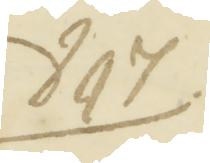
847.
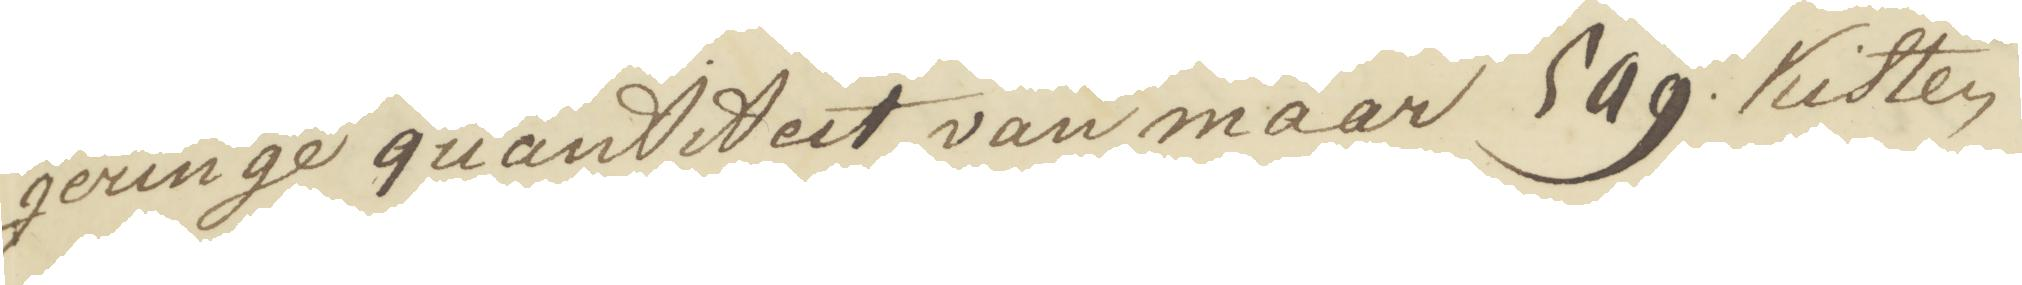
geringe quantiteit van maar 549. kisten
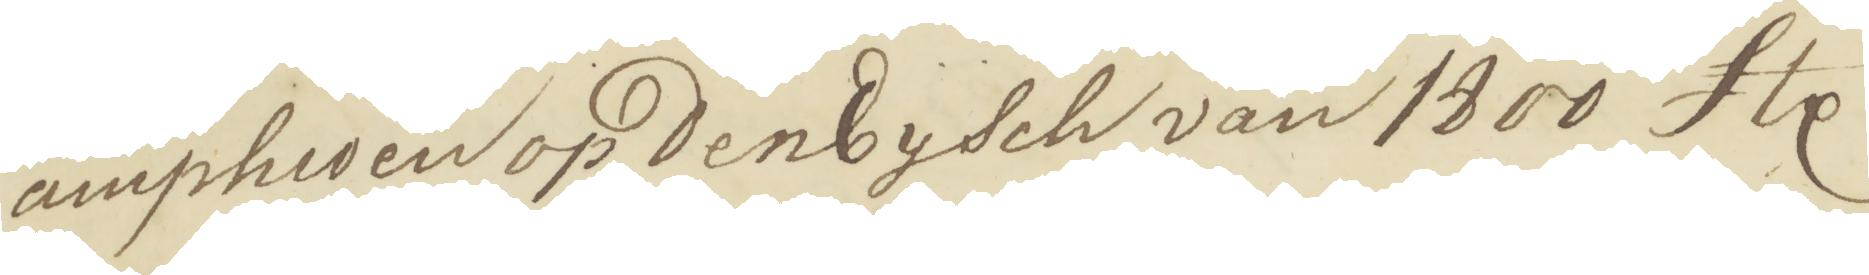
amphioen op den Eijsch van 1800 stx
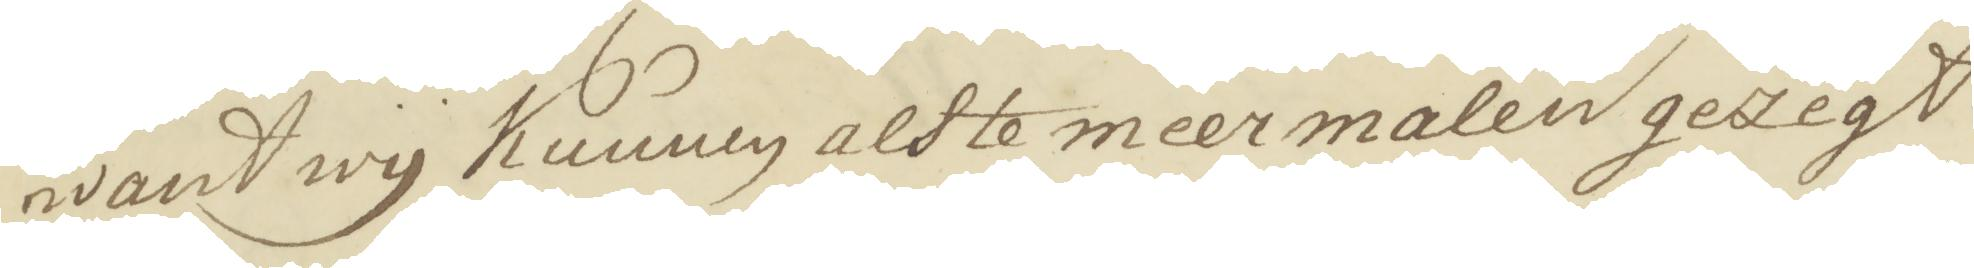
want wij Kunnen als te meermalen gezegt
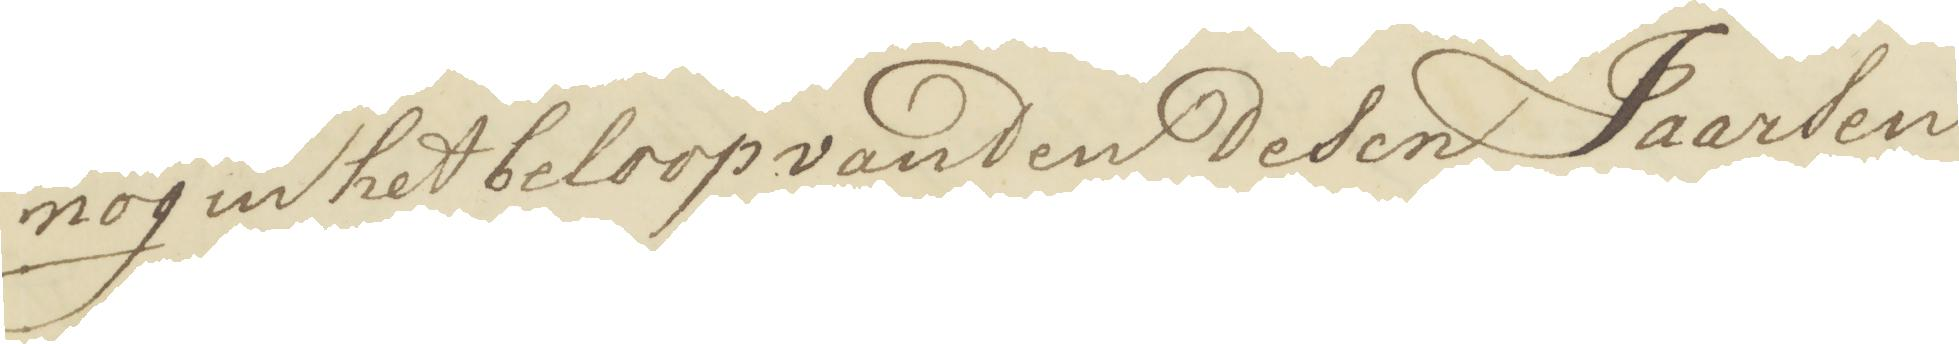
nog in het beloop van den desen Jaarsen
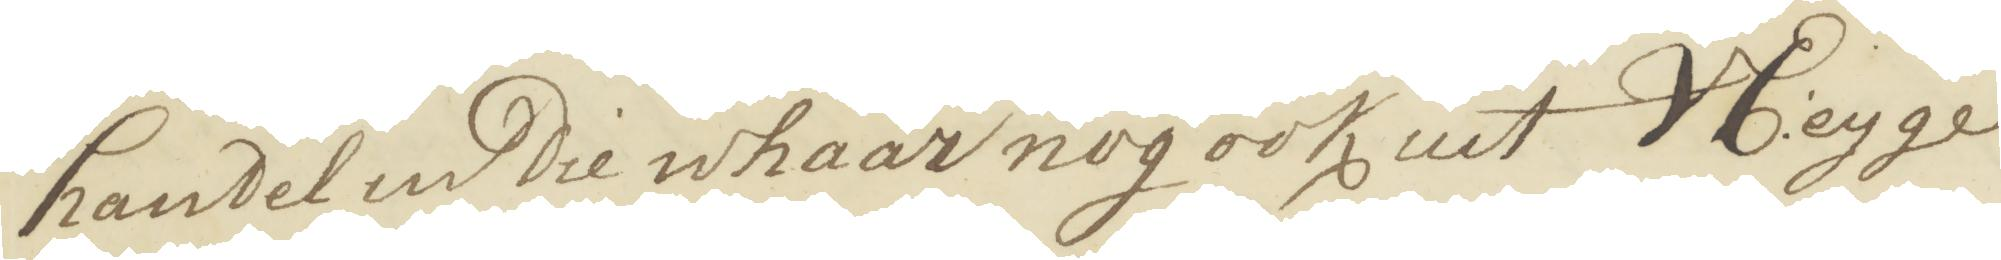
handel in die whaar nog ook uit VE: eijge
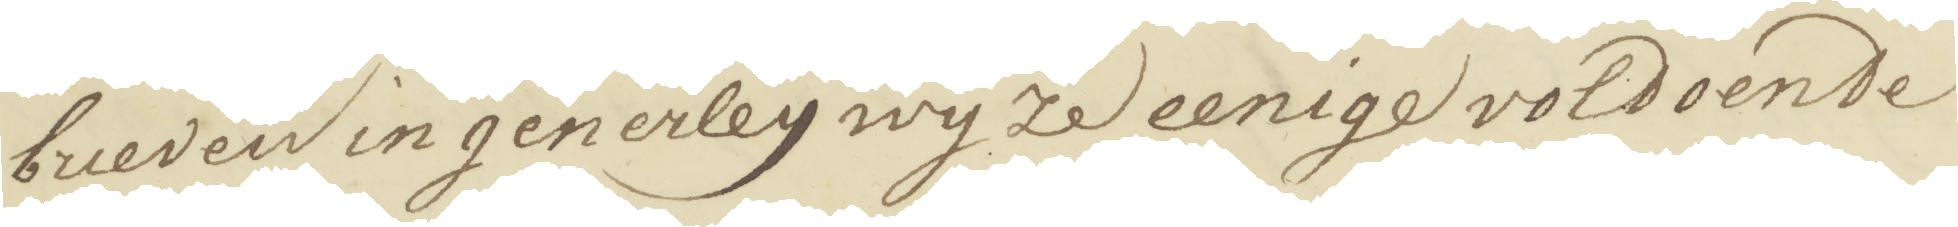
brieven in generleij wijze eenige voldoende
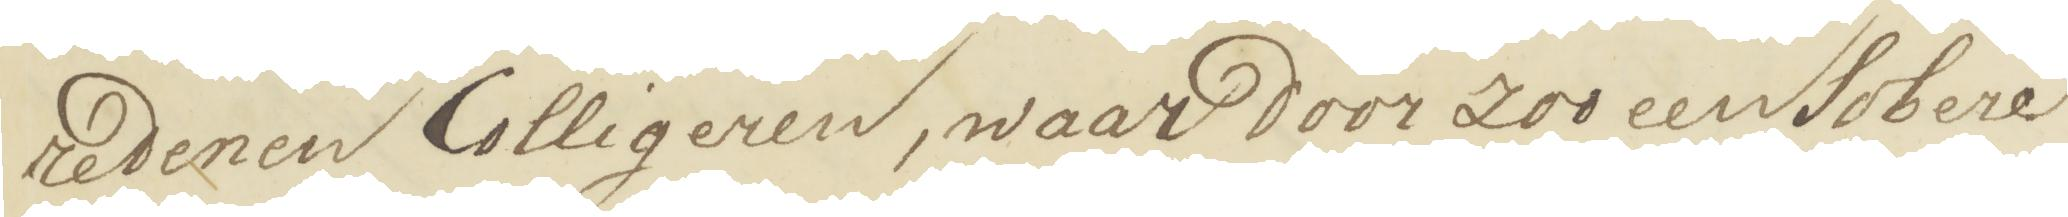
redenen colligeren, waar door zoo een Sobere
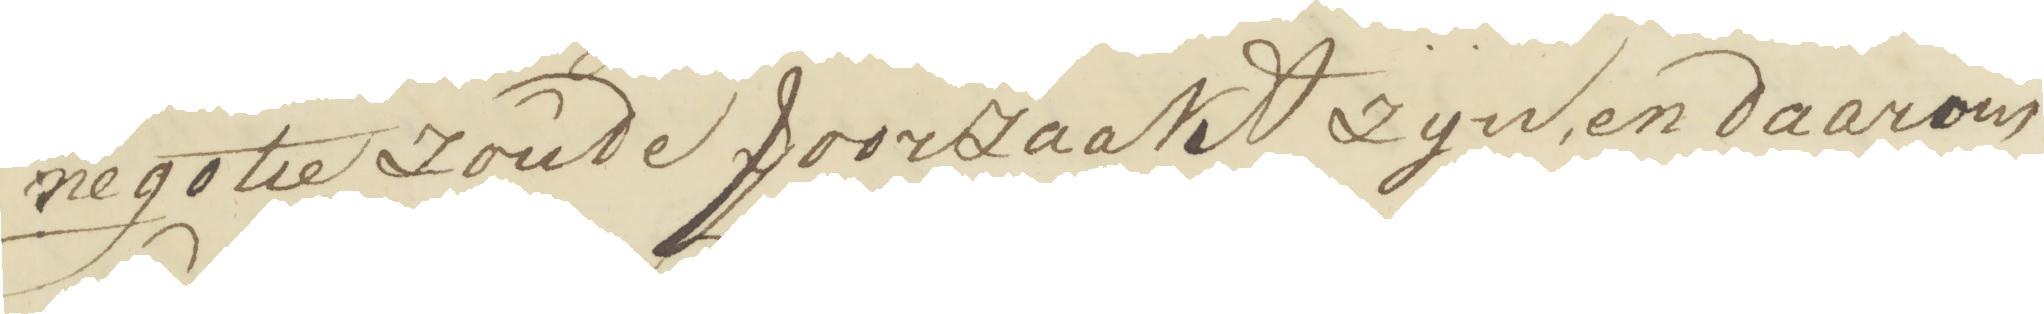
negotie zoude Veroorzaakt zijn, en daarom
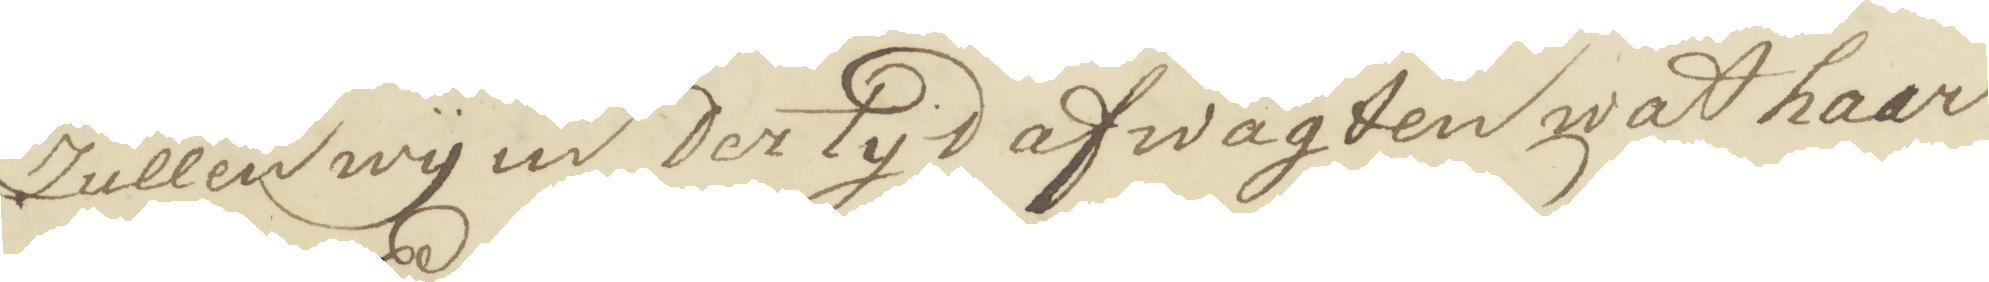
Zullen wij in der tijd afwagten wat haar
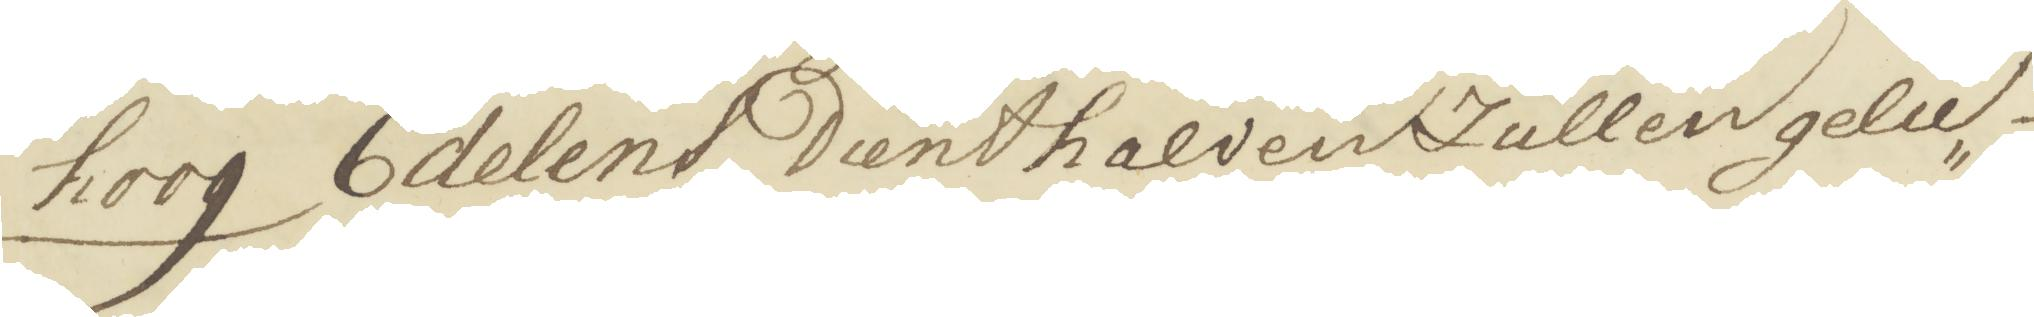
hoog Edelens dienthalven Zullen gelie„
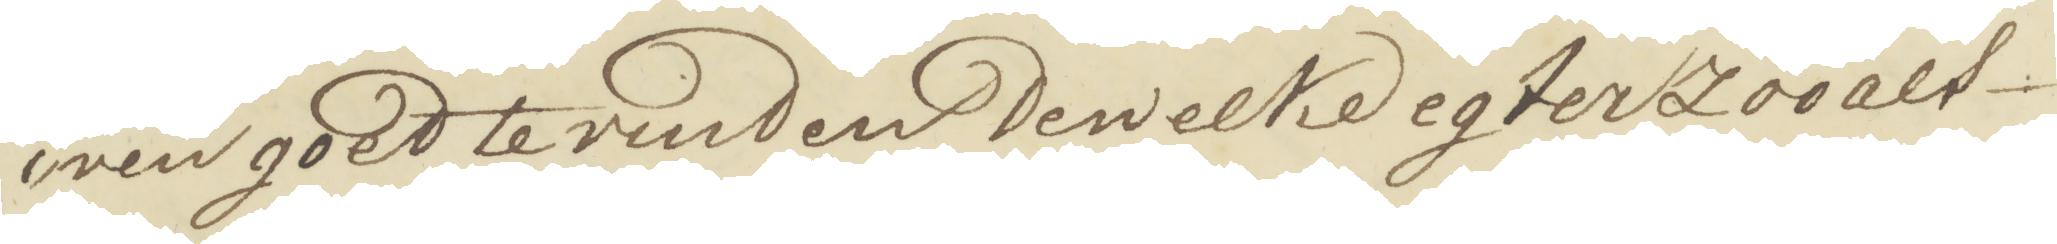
ven goed te vinden den welke egter zoo als
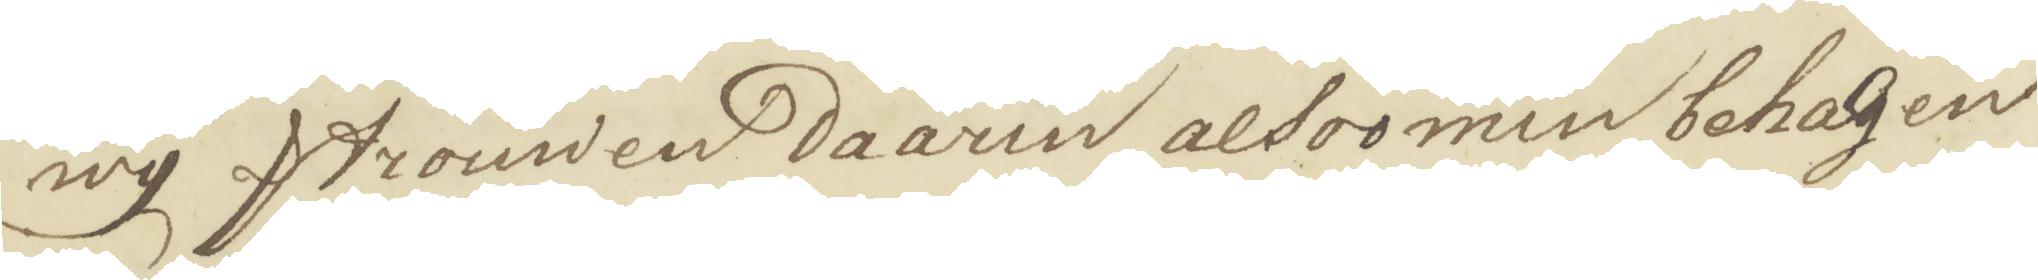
wij vertrouwen daarin alsoo min behagen
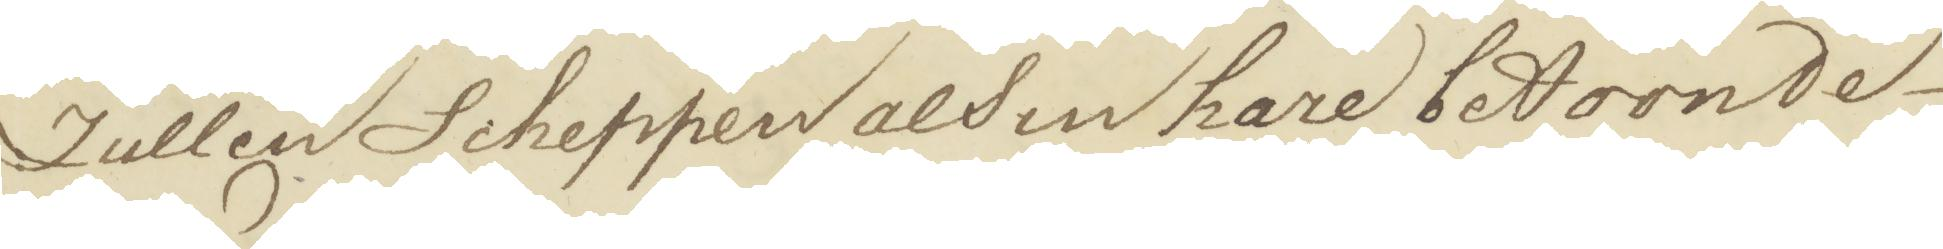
Zullen Scheppen als in hare betoonde
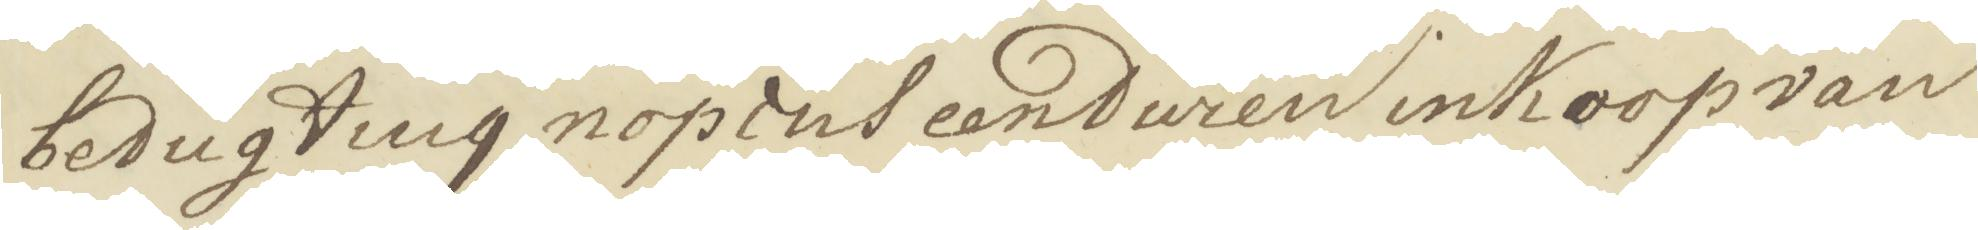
bedugting nopens een duren inkoop van
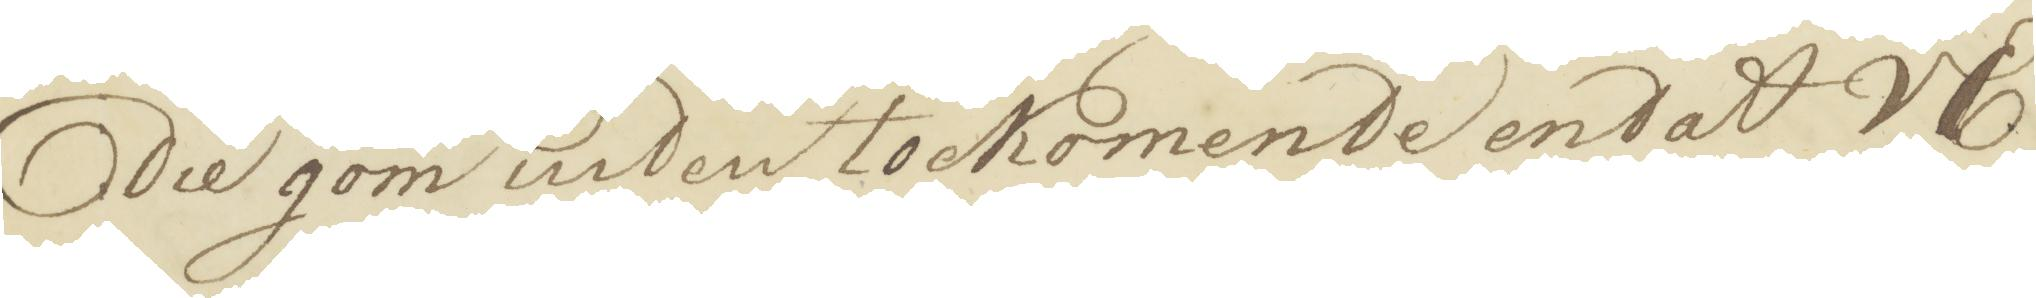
die gom in den toekomende en dat VE:
